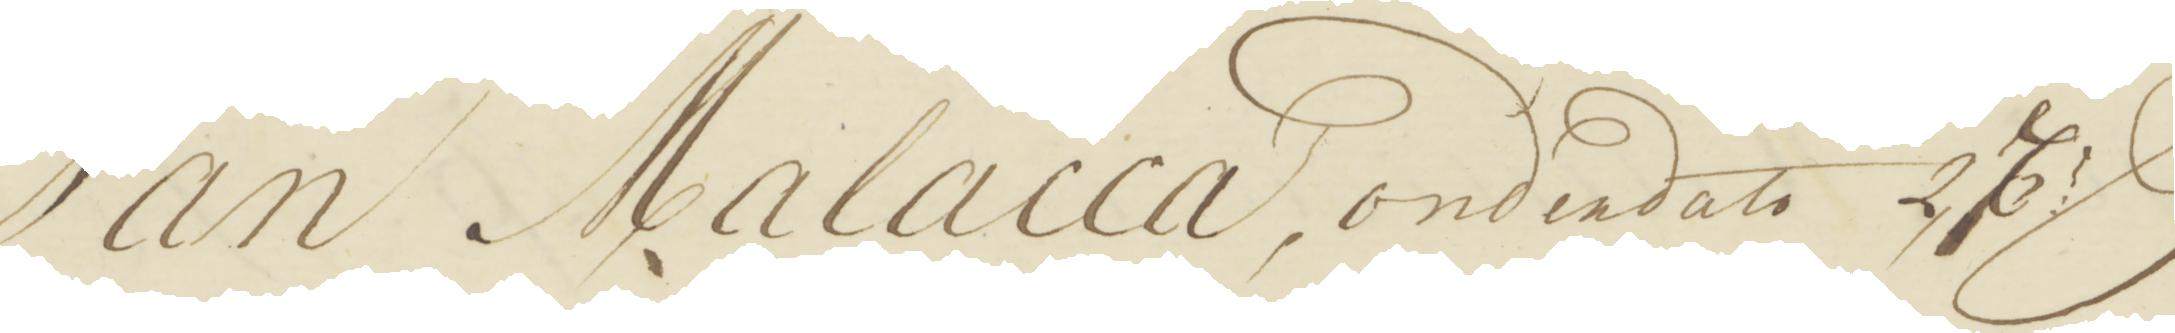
Van Malacca, onderdato 27:' Decb=r 1740.
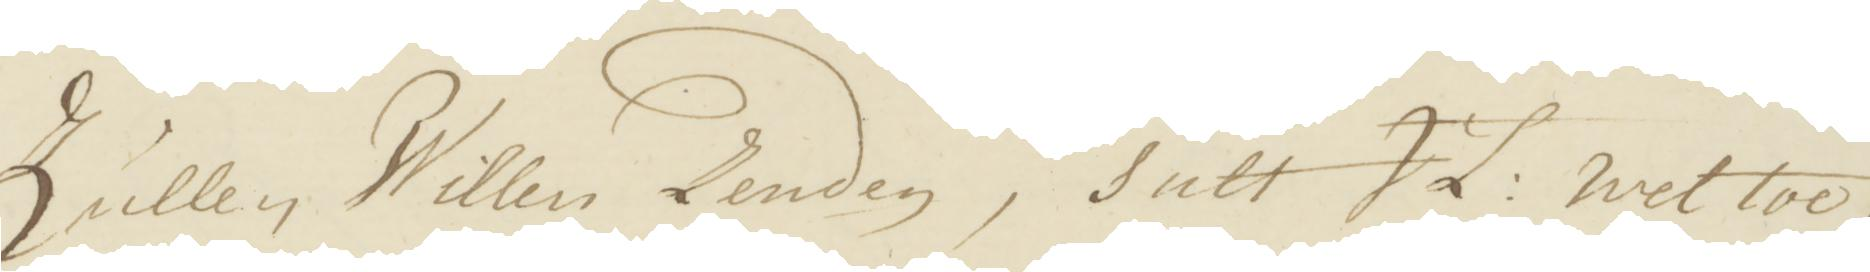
Zullen Willen zenden, sult VL: wel toe„
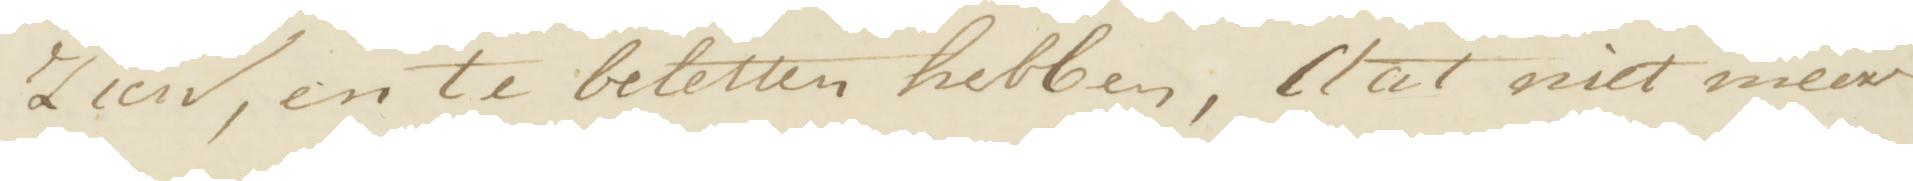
zien, en te beletten hebben, dat niet meer
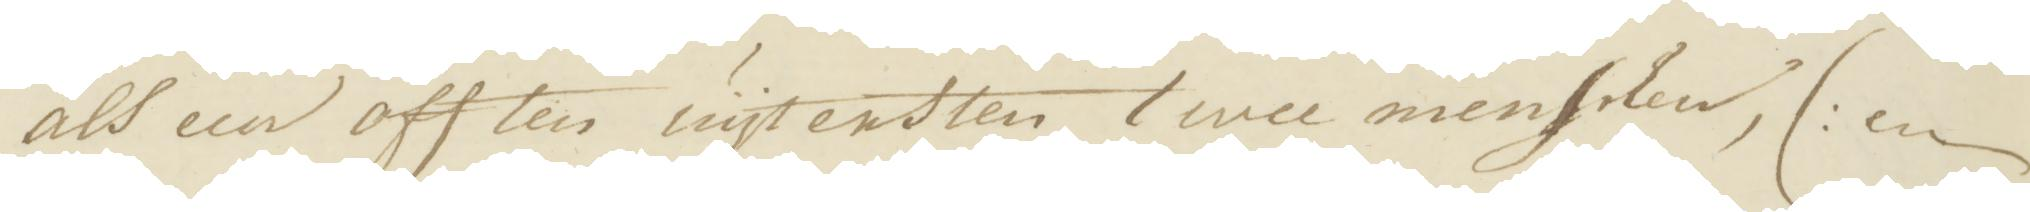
als een off ten uijtersten twee menschen, (: en
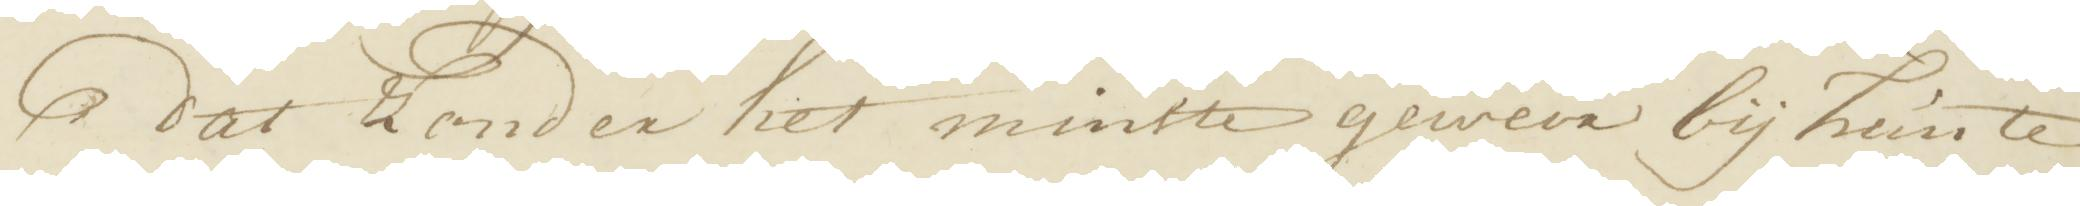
dat zonder het minste geweir bij hun te
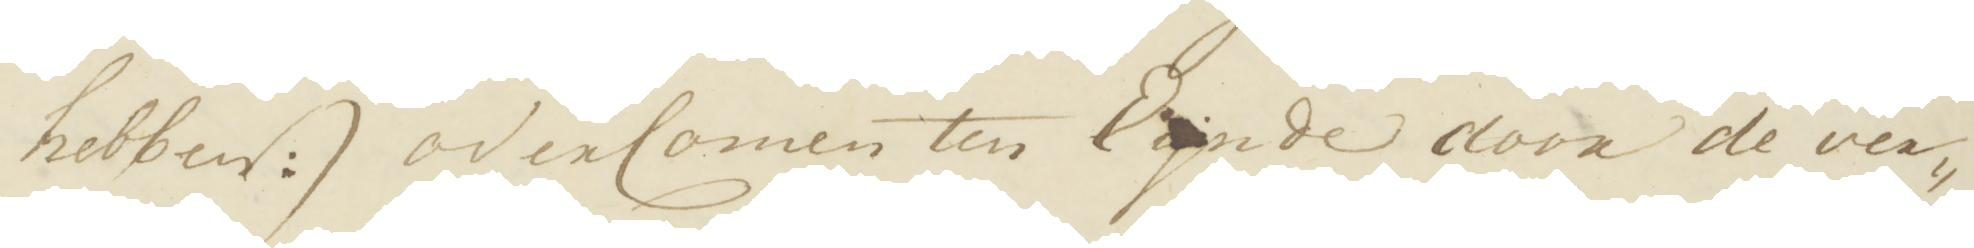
hebben:) overcomen ten Eijnde door de ver„
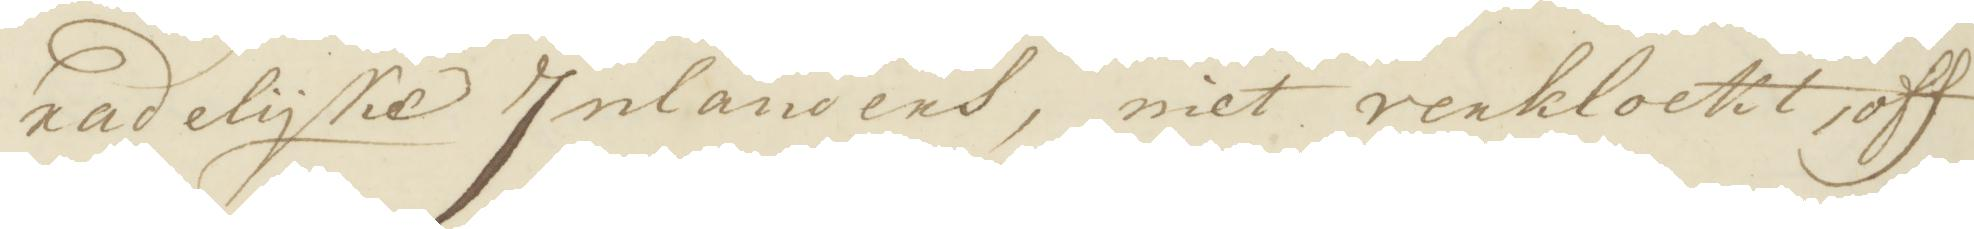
radelijke Jnlanders, niet verkloekt, off
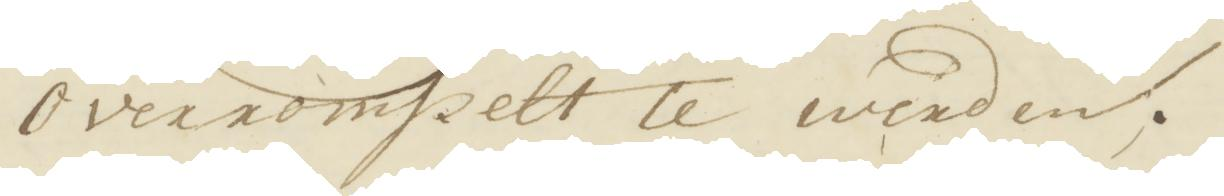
overrompelt te werden.
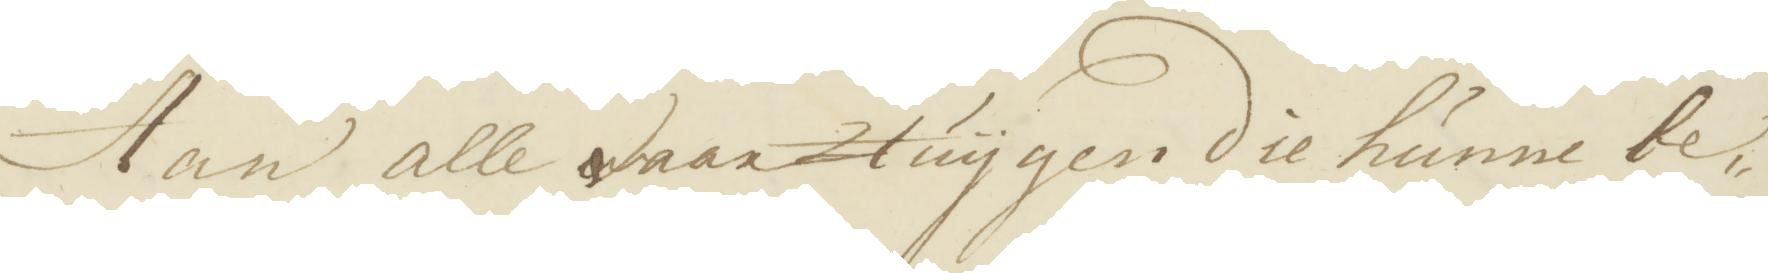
Aan alle vaartuijgen die hunne be„
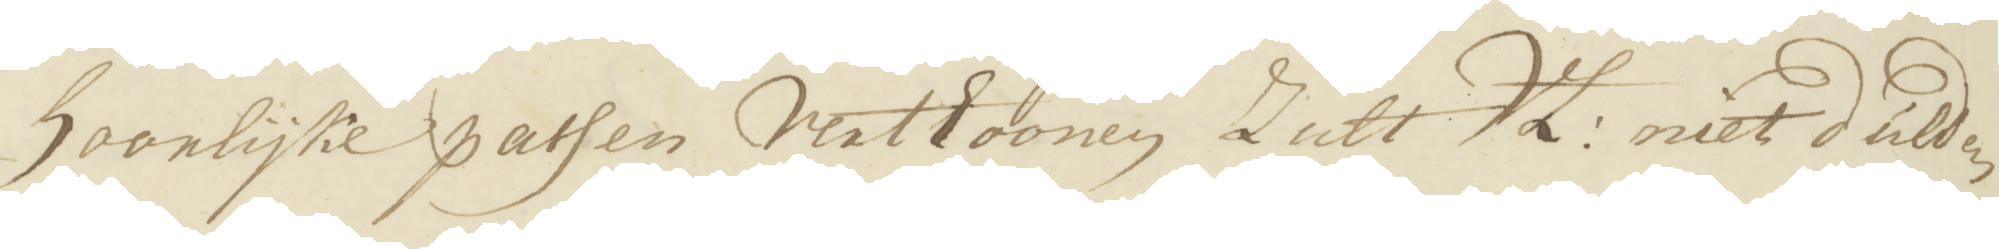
hoorlijke passen verthoonen zult VL: niet dulden
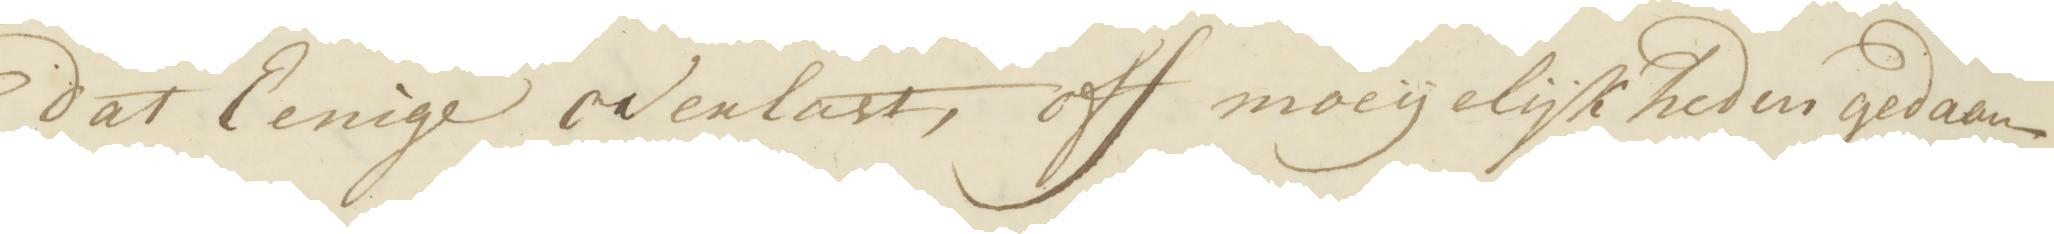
dat Eenige overlast, off moeijelijkheden gedaan
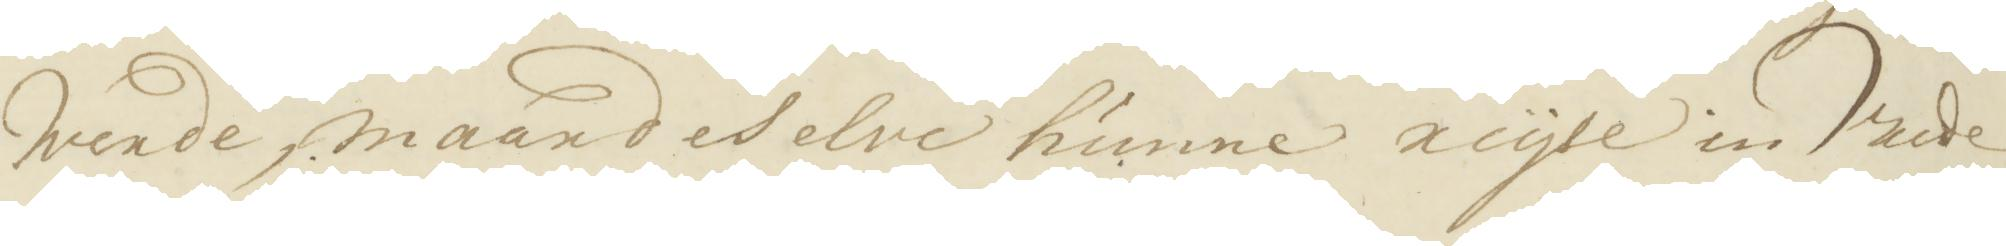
werde, maar deselve hunne reijse in vrede
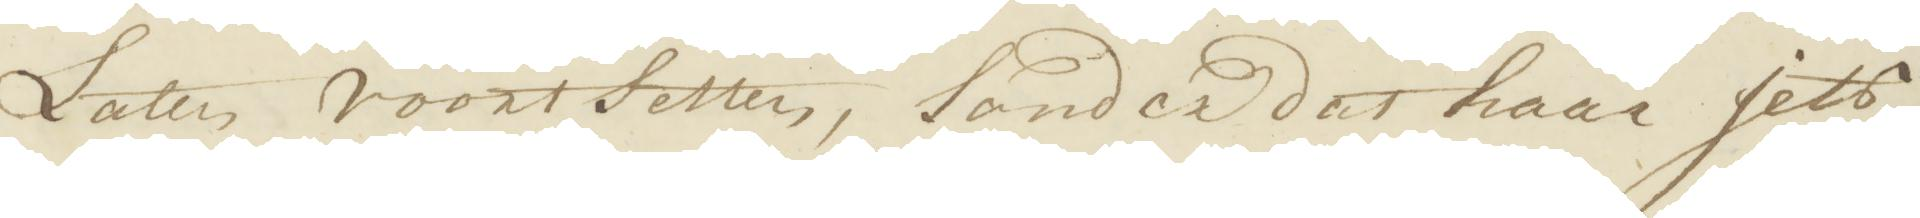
laten voortsetten, sonder dat haar jets
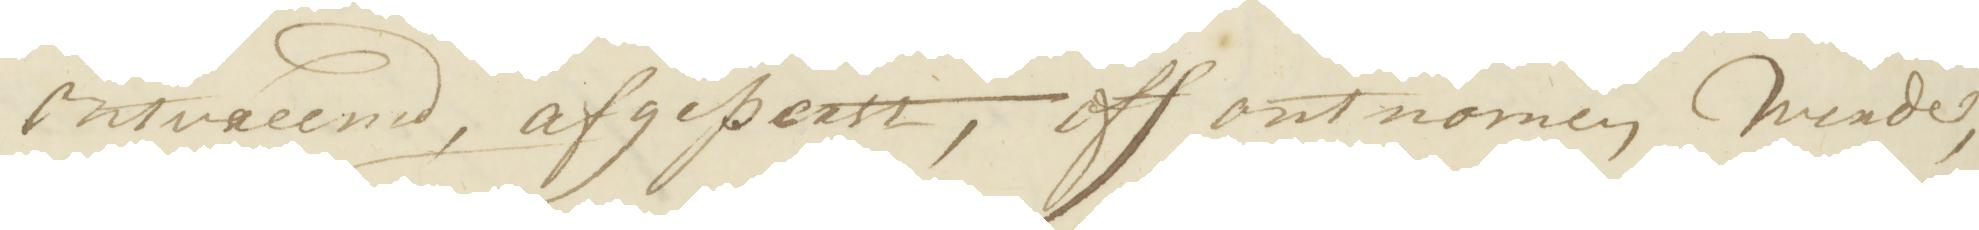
ontvreemd, afgeperst, off ontnomen werde,
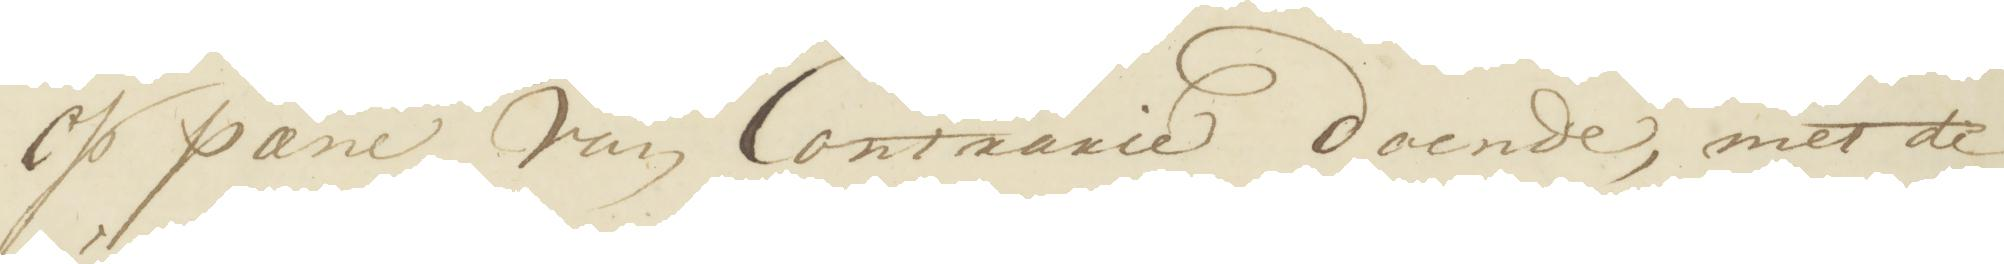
op pane van contrarie doende, met de
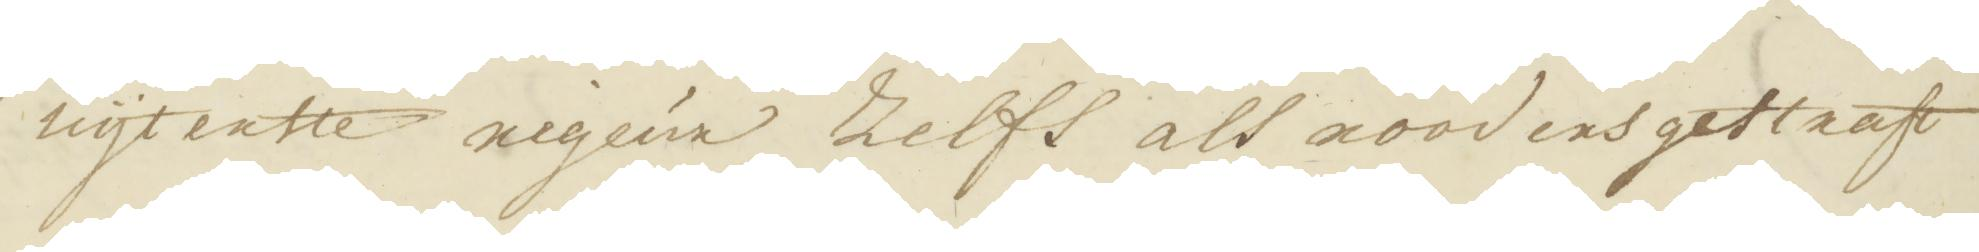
uijterste rigeur zelfs als roovers gestraft
